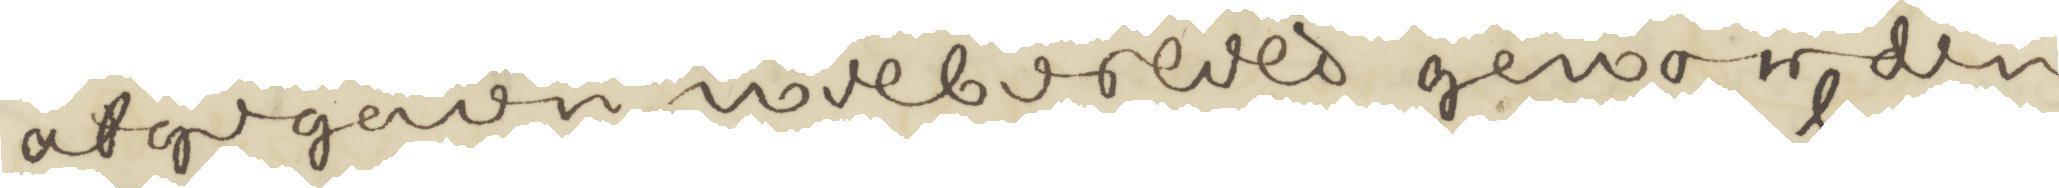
afgegaen welbesteld gewoirden
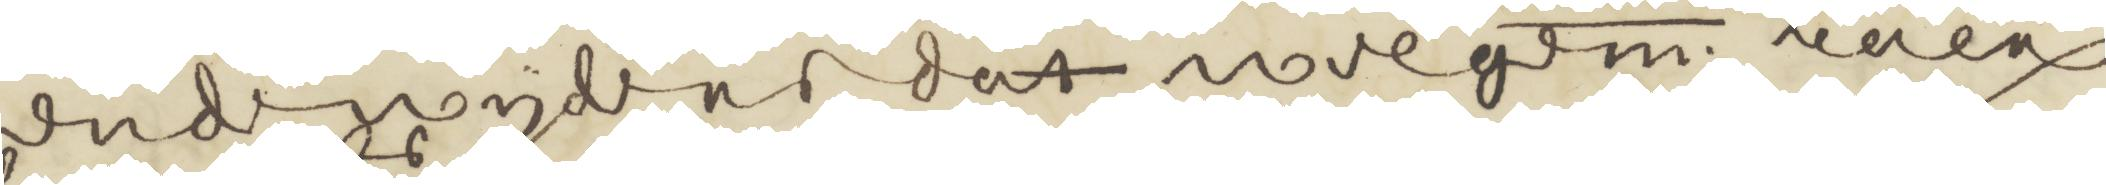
ende wijders dat welgem: haer
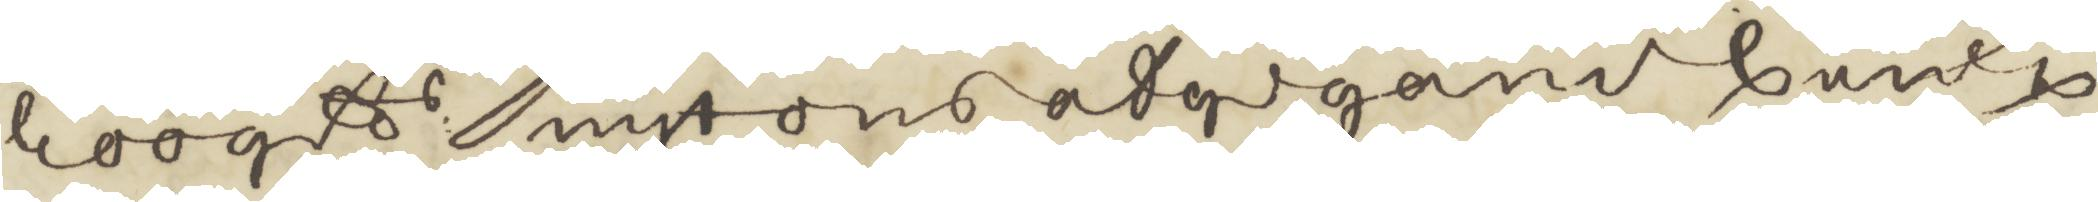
hoogEd:s uyt ons afgegane briev
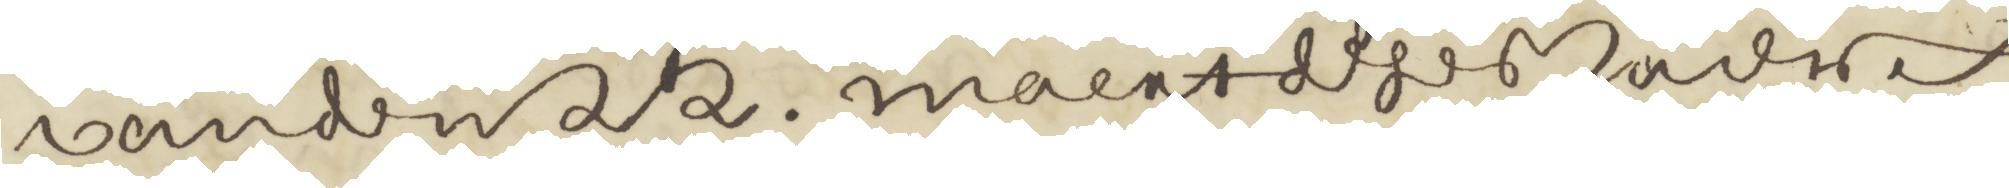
van den 22. maert deses Jaers
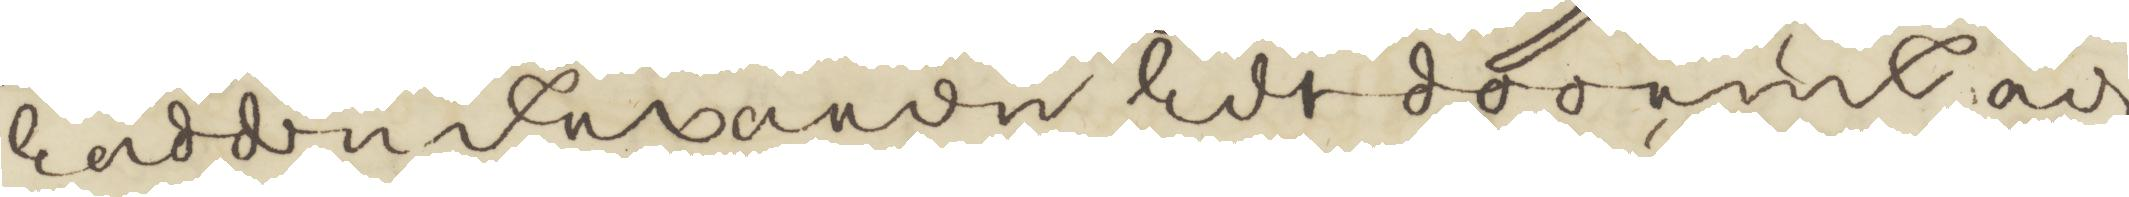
hadden Ervaren het door uE: aen
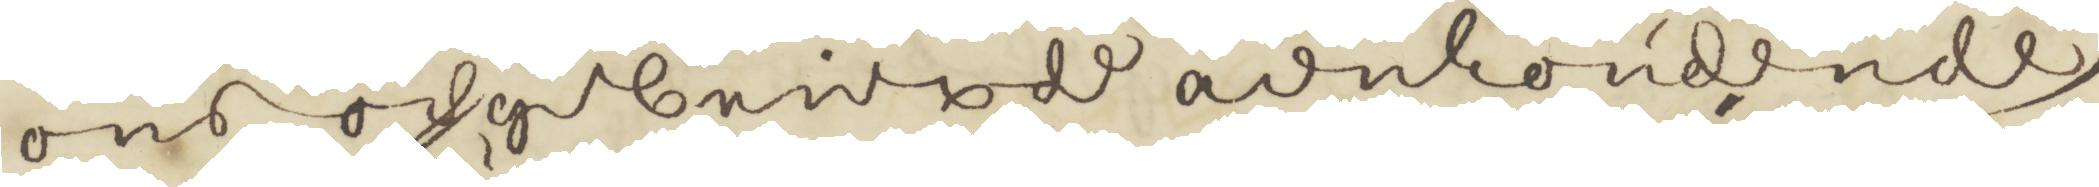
ons overgebrievde aenhoudende
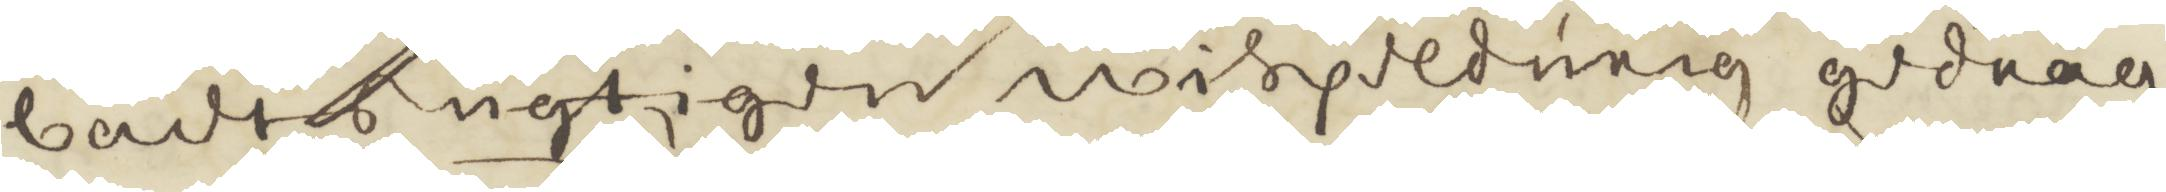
baetsugtigen wispeldurig gedraeg
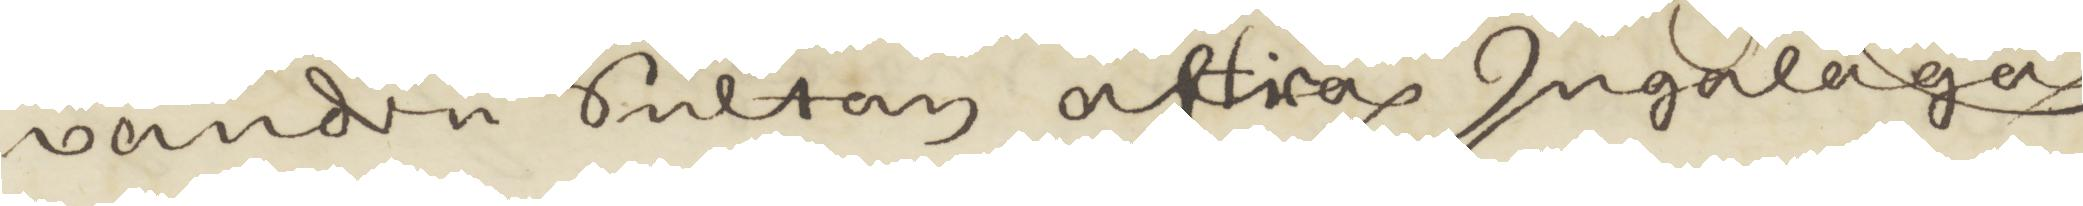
vanden sultan astra Ingalaga
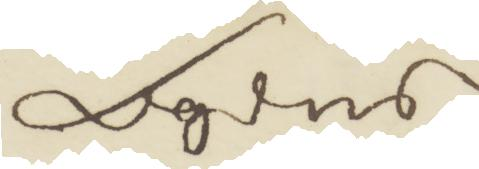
Egens
